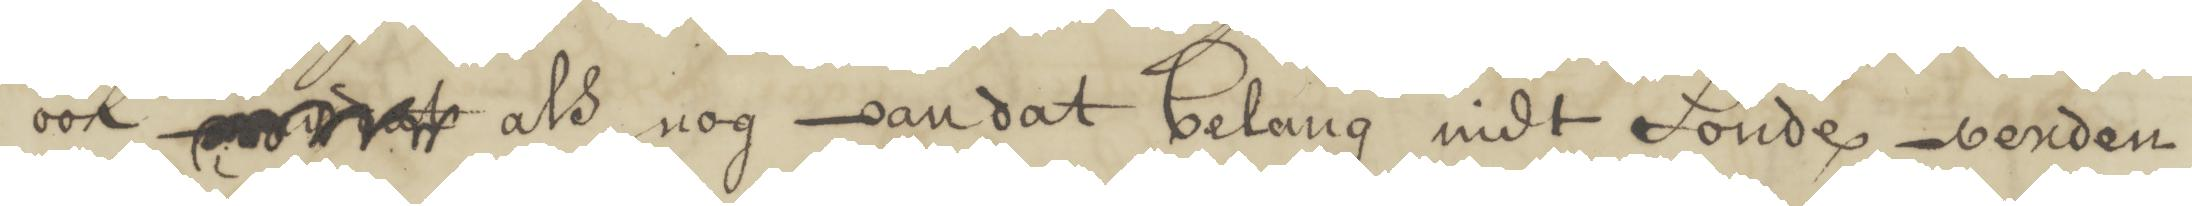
ook vordat als nog van dat belang niet soude werden
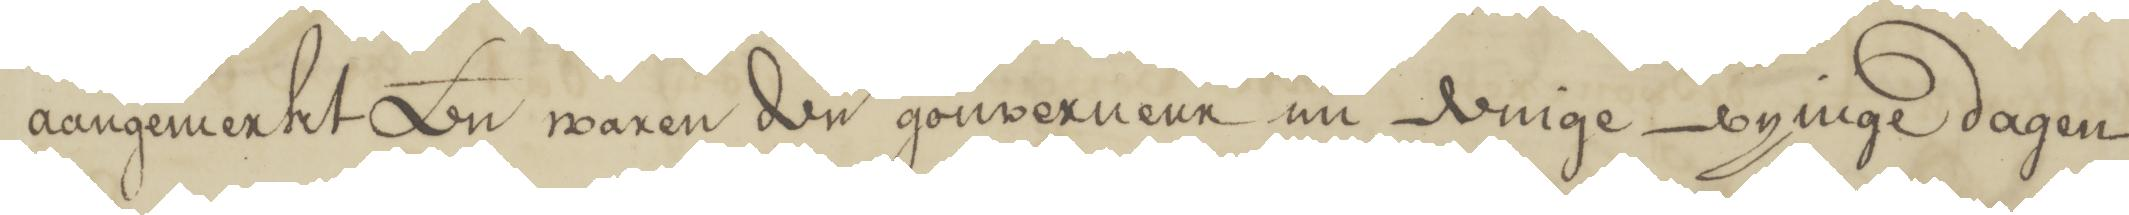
aangemerkt ten waren den gouverneur nu eenige wynige dagen
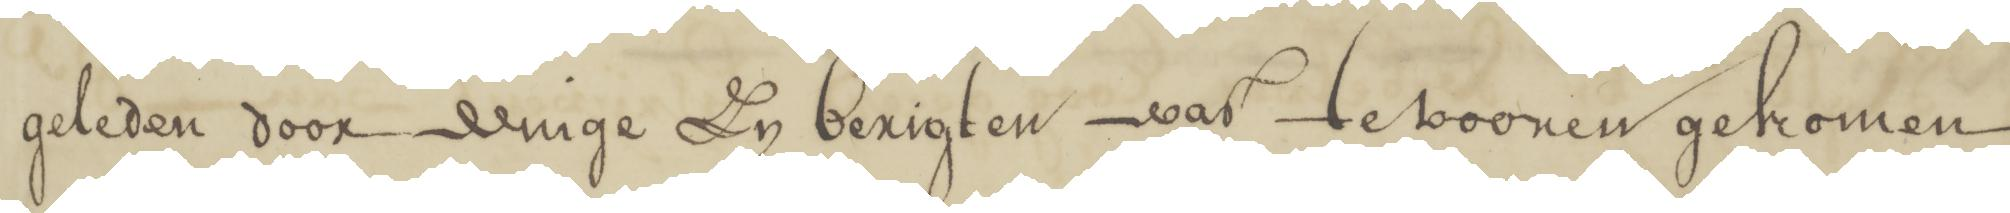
geleden door eenige zy berigten was te vooren gekomen
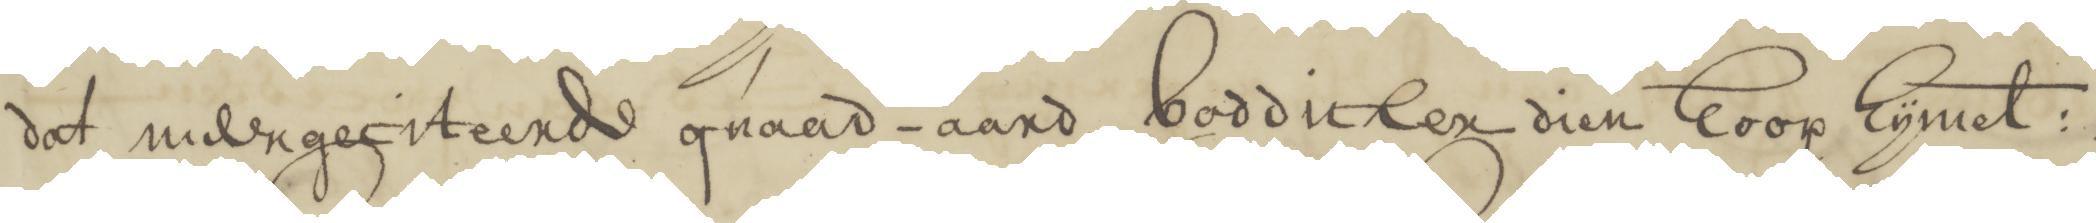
dat meergeciteerde quaad-aard boddicker dien hoop hijmelijk
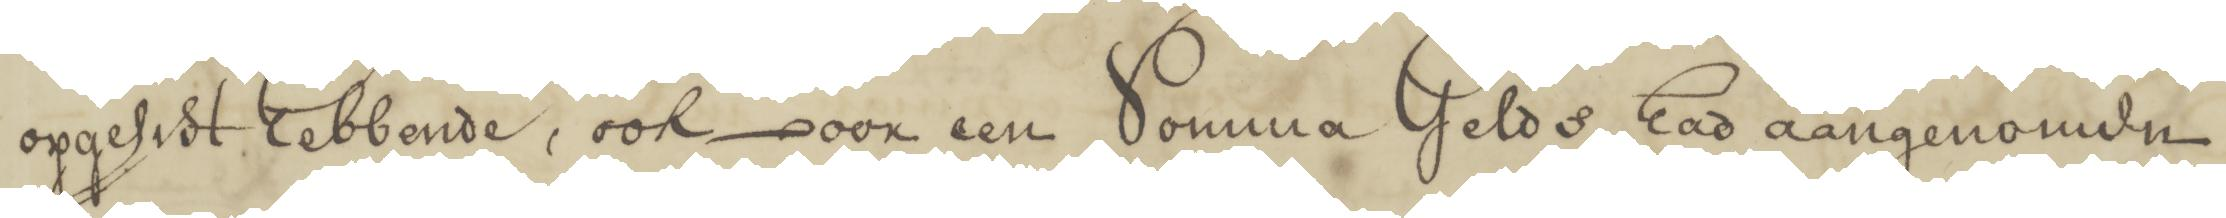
opgehist hebbende, ook voor een Somma Gelds had aangenomen
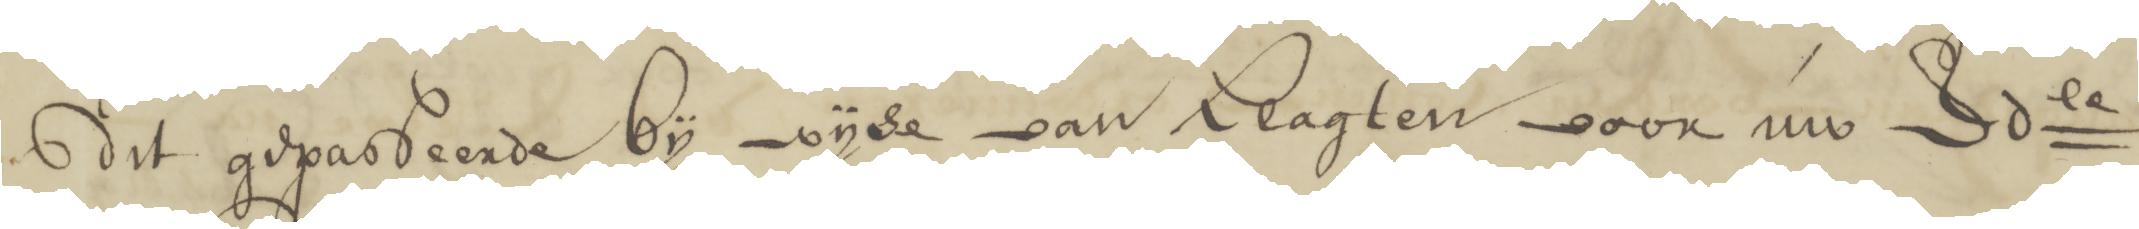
dit gepasseerde bij wijse van klagten voor uw Ed=le
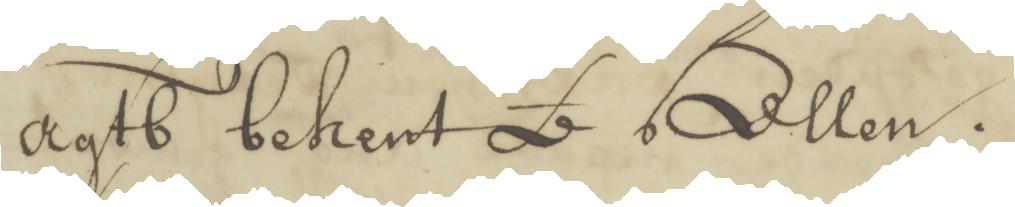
agtb bekent te stellen.
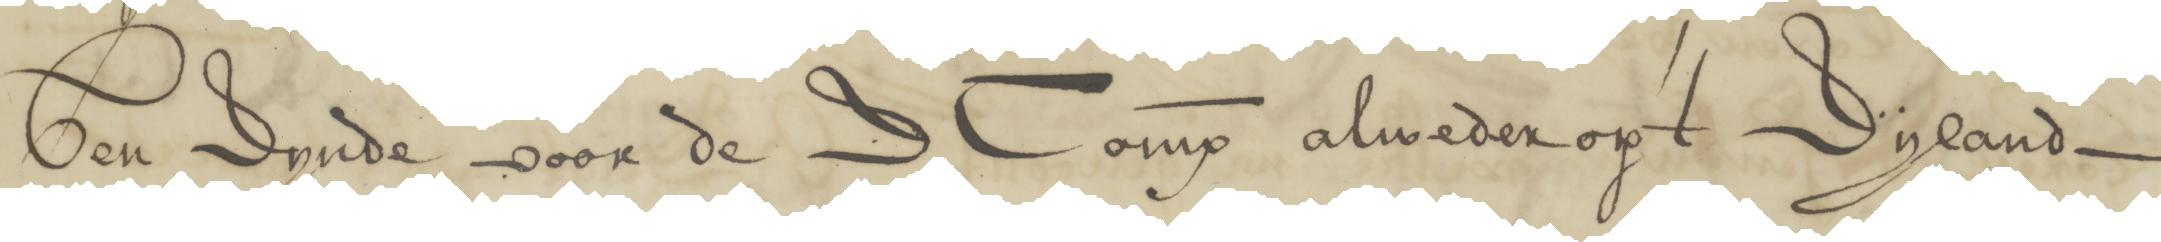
Ten Eynde, voor de E Comp alweder op ’t Eijland —
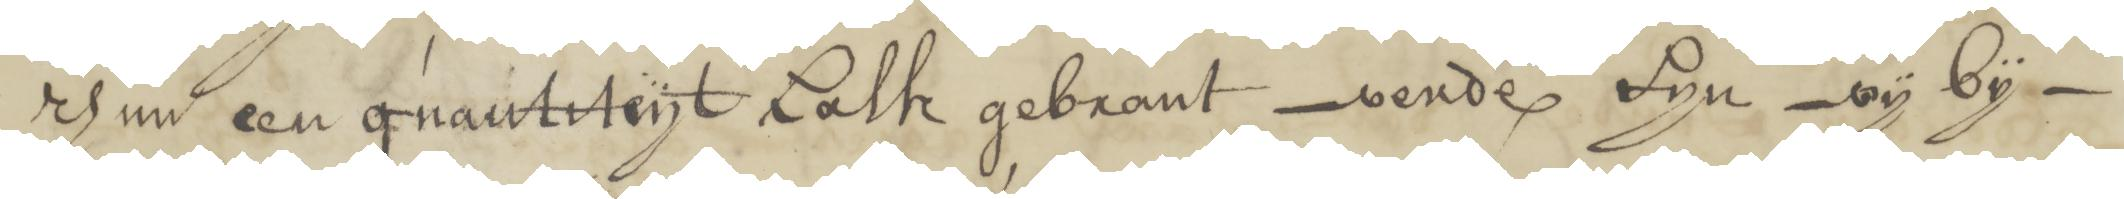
rhun een quantiteijt kalk gebrant werde syn wij bij —
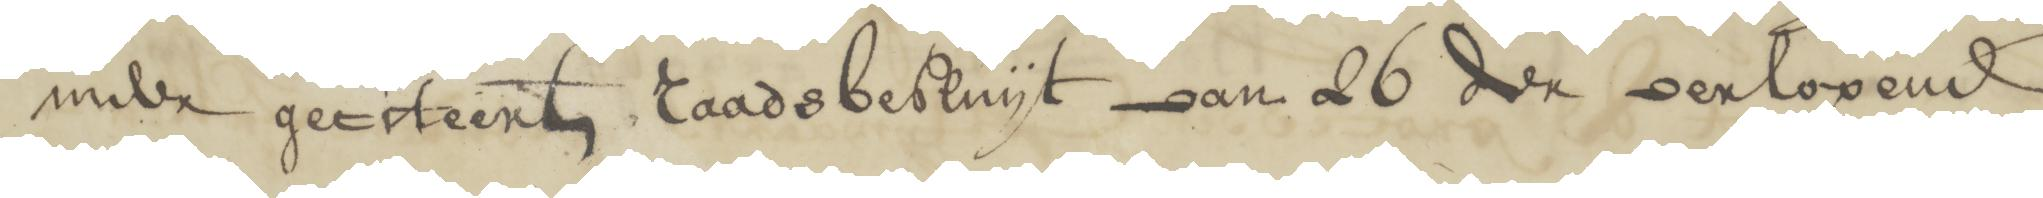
meer geciteert raadsbesluijt van 26 der verlopene
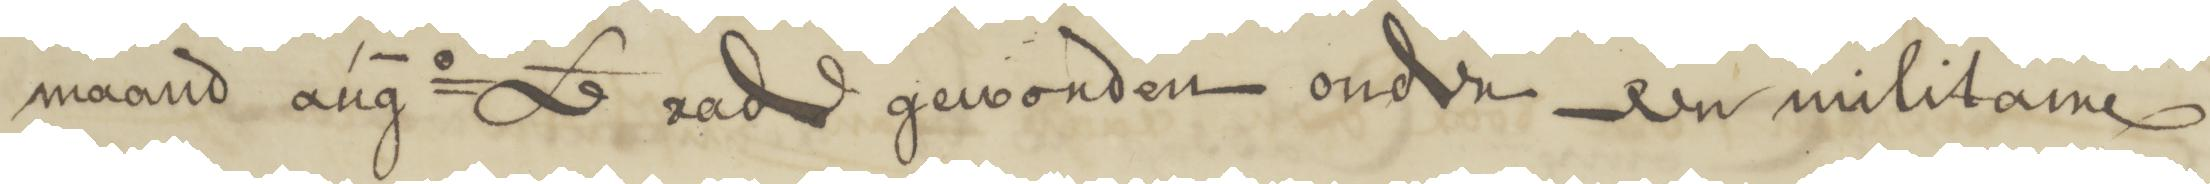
maand aug=o te rade geworden onder een militaire
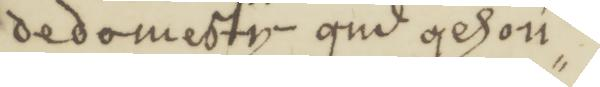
de domestijque gehou„
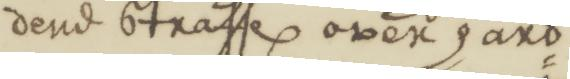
dene straffe over hard„
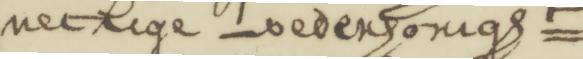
neckige wederhorigh=t
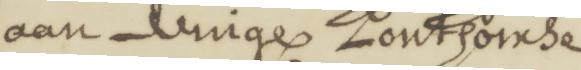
aan eenige Lonthoirse
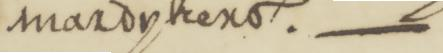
mardykers.
